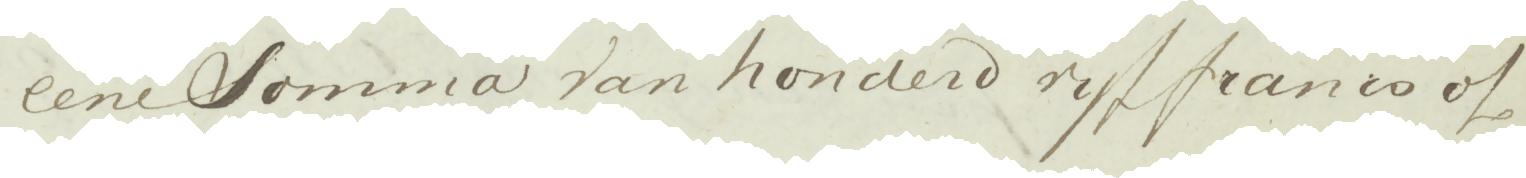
eene Somma van honderd vyf francs of
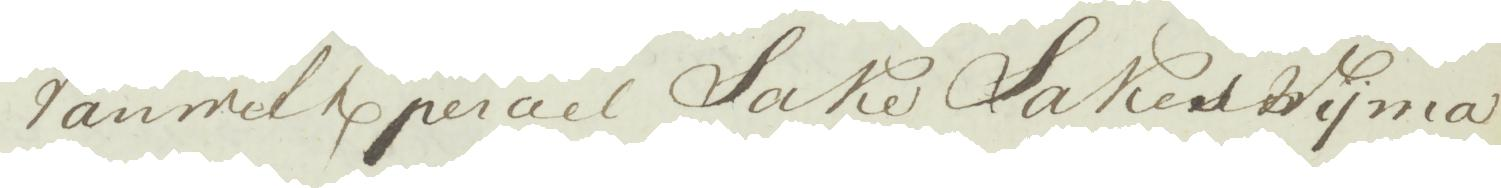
Van welk perceel Sake Sakes Wijma
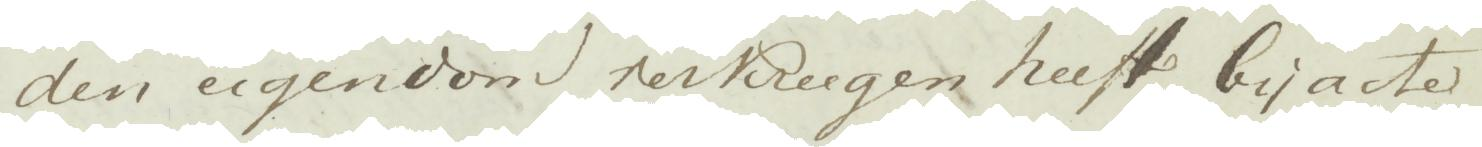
den eigendom verkreegen heeft bij acte
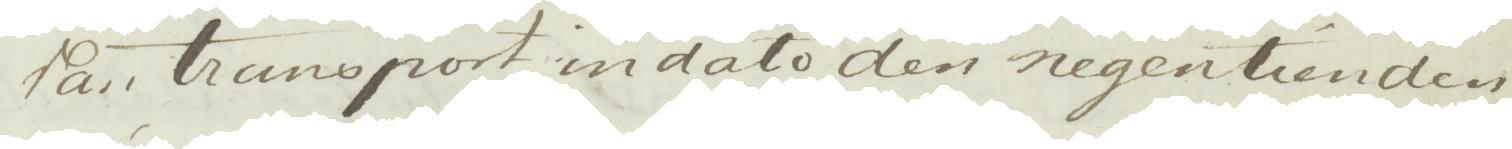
van transport in dato den negentienden
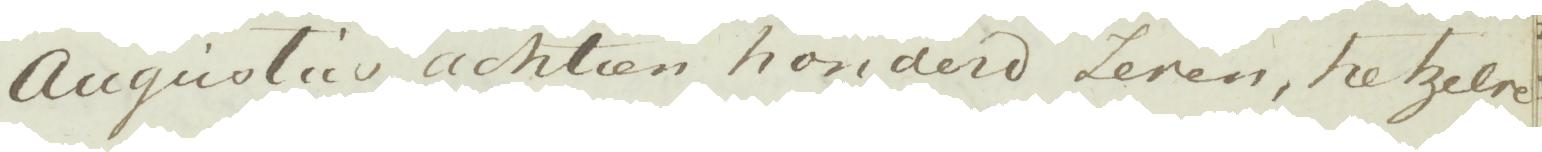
Augustus achtien honderd zeven, hetzelve
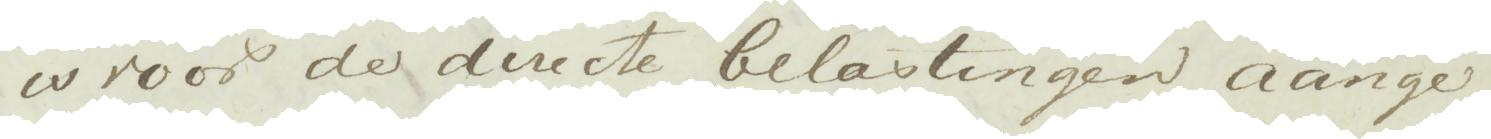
is voor de directe belastingen aange
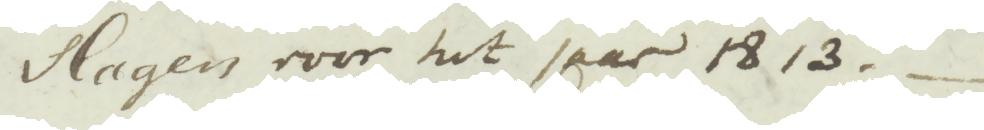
slagen voor het jaar 1813. _
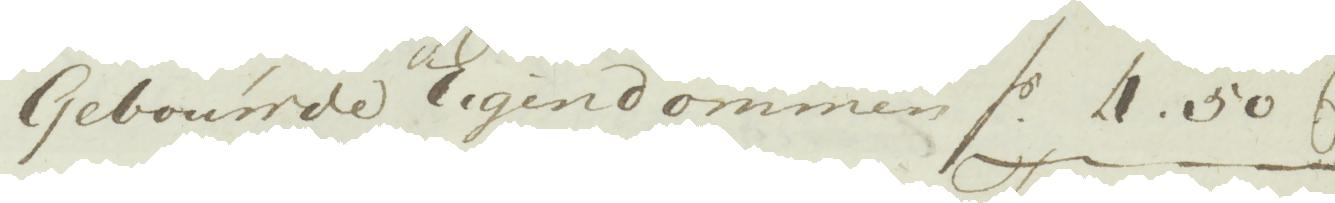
Gebouwde Eigendommen ƒ. 4.50
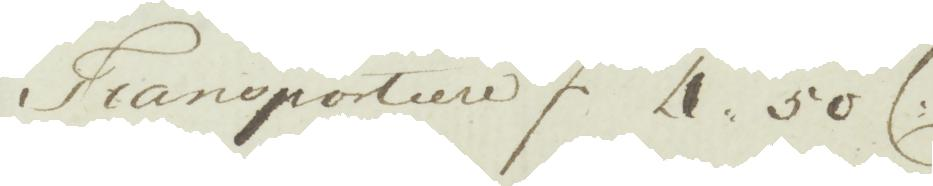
Transporteere ƒ 4„ 50 C:
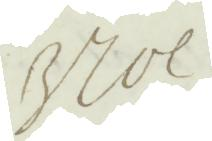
Vrol
